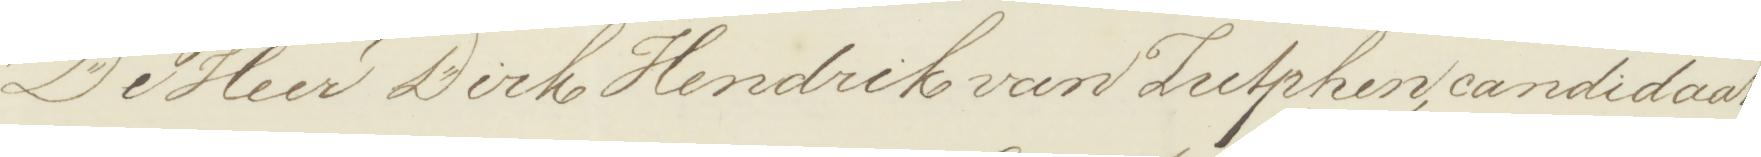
De Heer Dirk Hendrik van Zutphen, candidaat
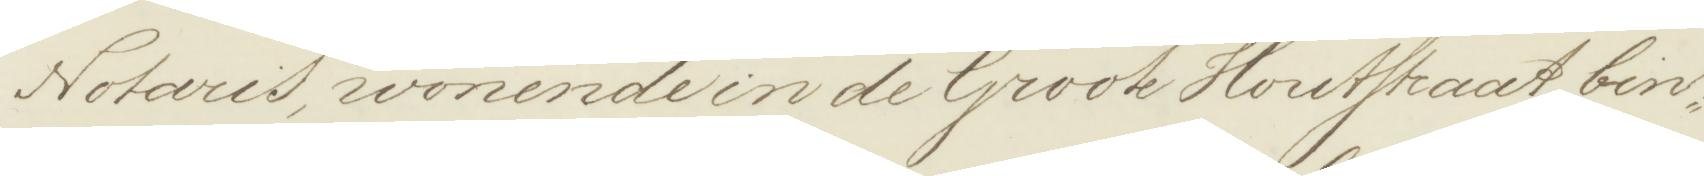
Notaris, wonende in de Groote Houtstraat bin„
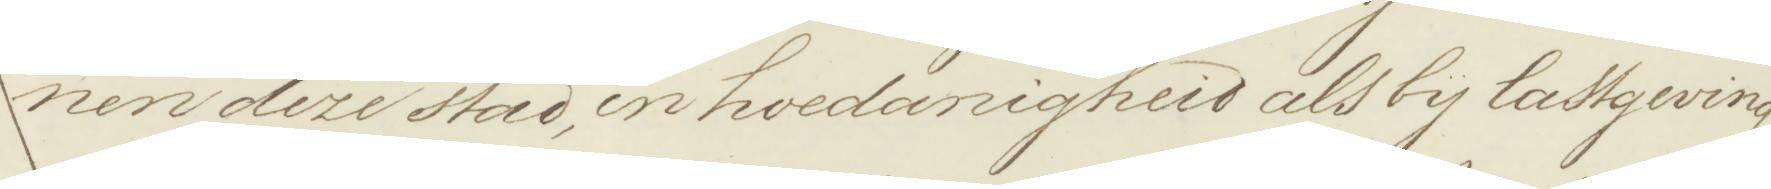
nen deze stad, in hoedanigheid als bij lastgeving
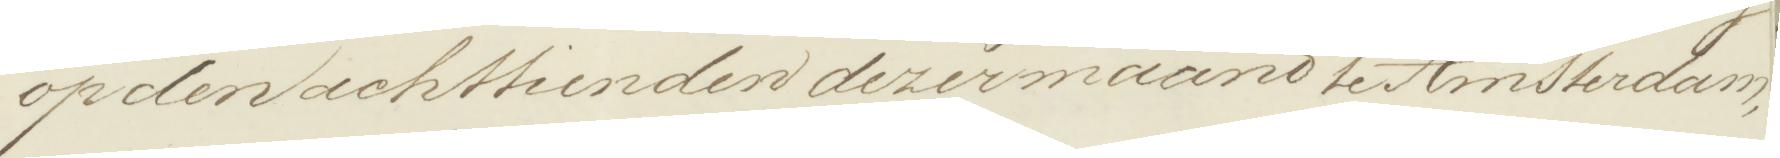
op den achttienden dezer maand te Amsterdam,
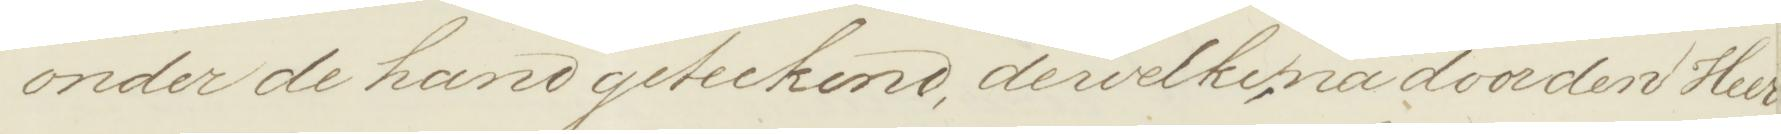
onder de hand geteekend, dewelke na door den Heer
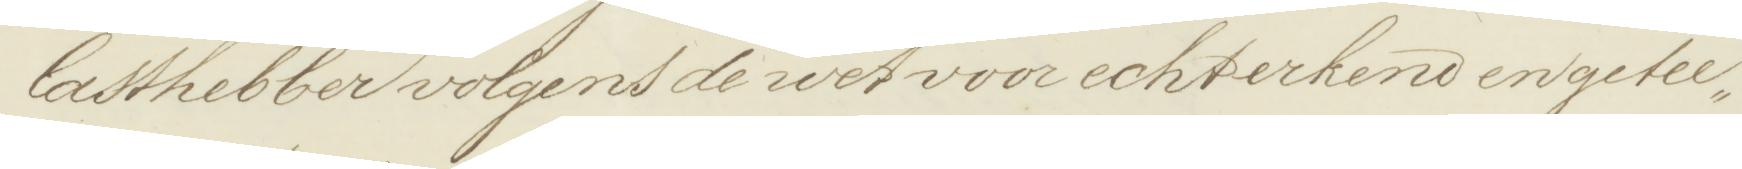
lasthebber volgens de wet voor echt erkend en getee„
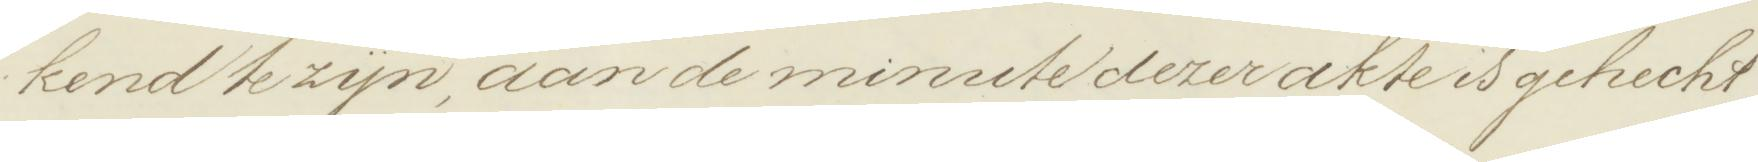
kend te zijn, aan de minute dezer akte is gehecht,
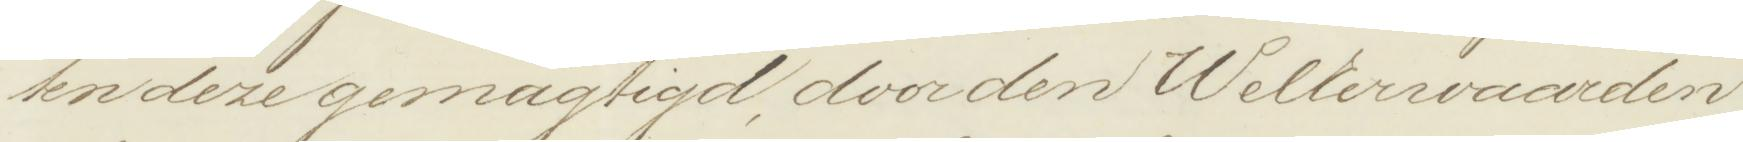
ten deze gemagtigd, door den WelEerwaarden
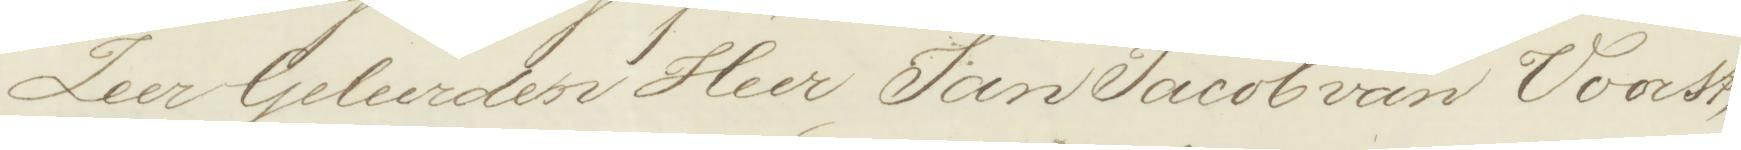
Zeer Geleerden Heer Ian Iacob van Voorst,
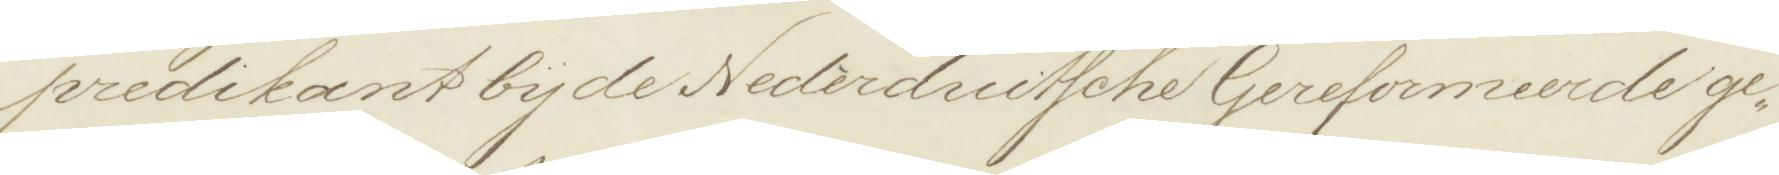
predikant bij de Nederduitsche Gereformeerde ge„
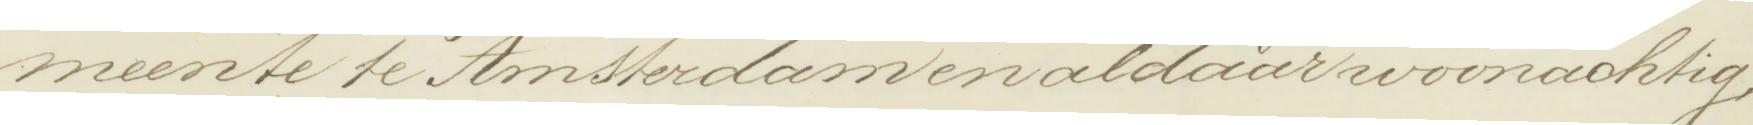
meente te Amsterdam en aldaar woonachtig
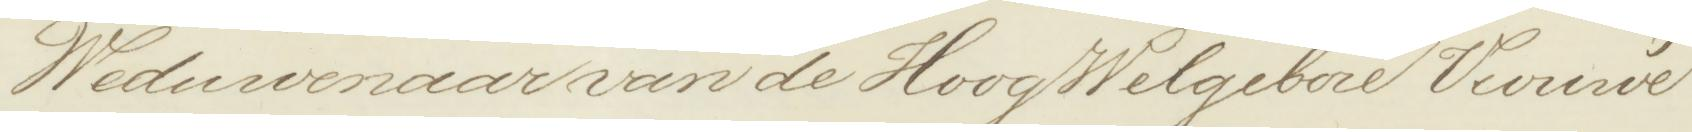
Weduwenaar van de Hoog Welgebore Vrouwe
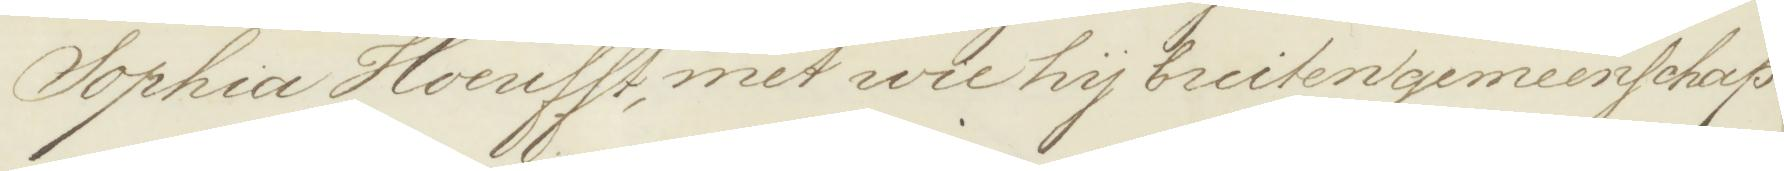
Sophia Hoeufft, met wie hij buiten gemeenschap
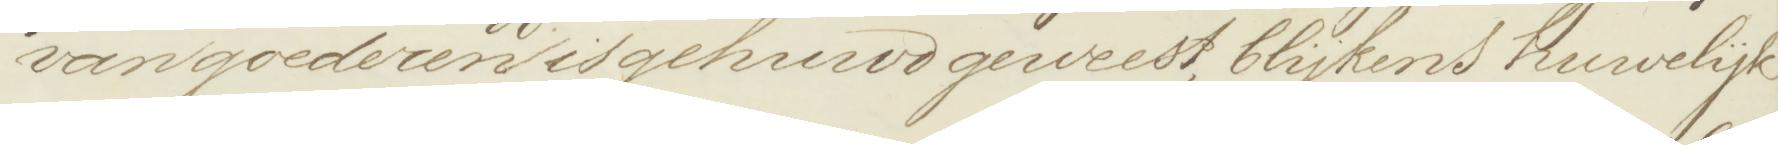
van goederen is gehuwd geweest, blijkens huwelijk
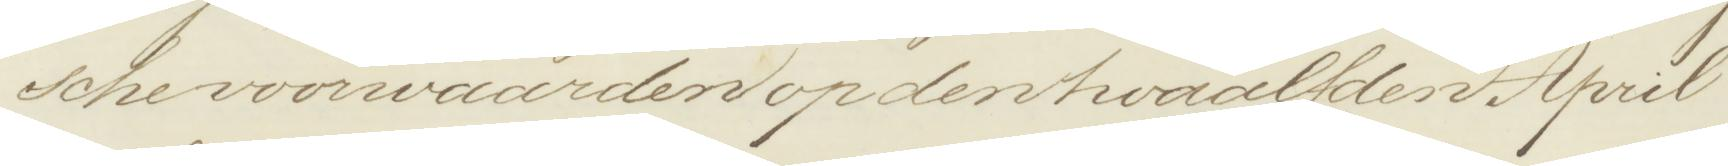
sche voorwaarden op den twaalfden April
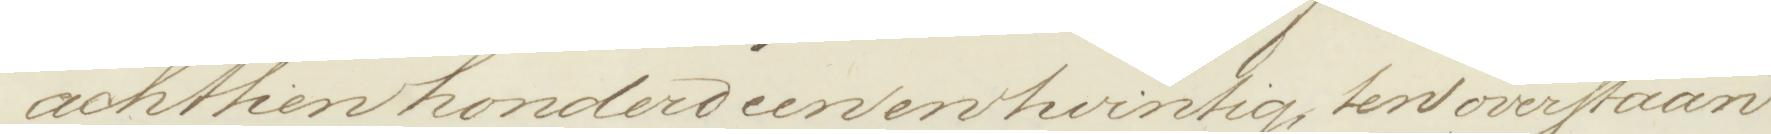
achttien honderd een en twintig, ten overstaan
